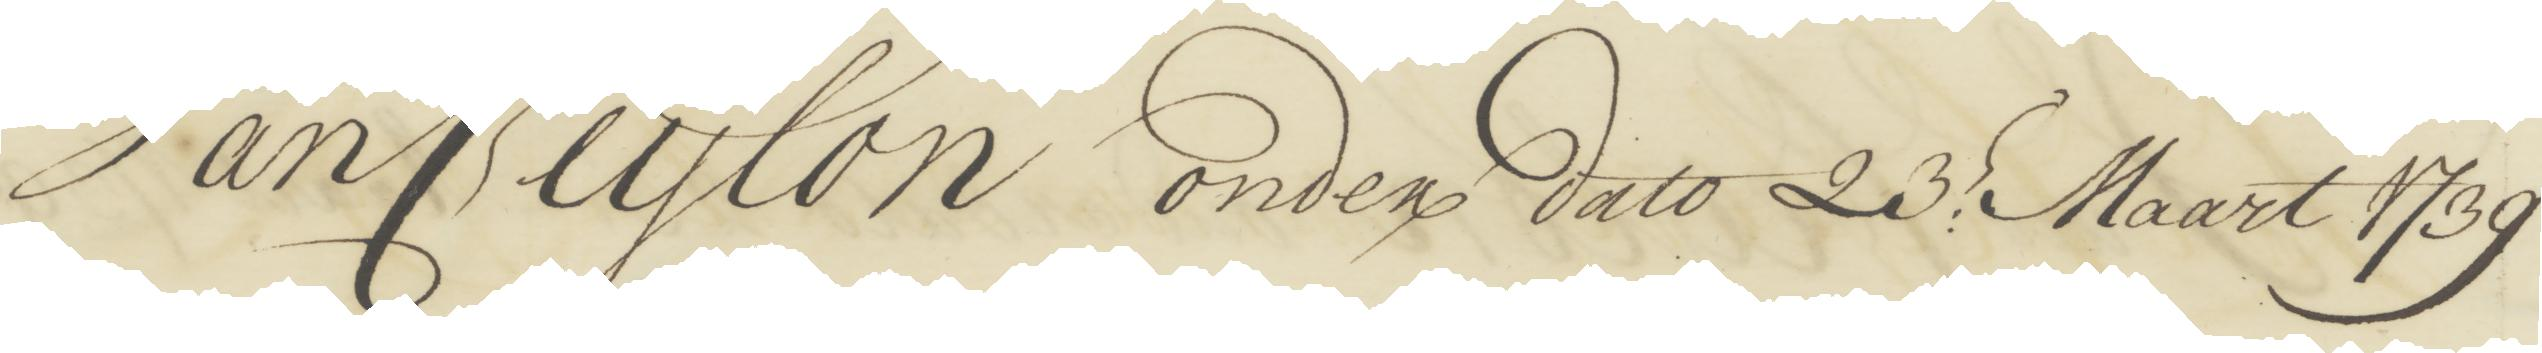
Van Ceijlon onder dato 23:' Maart 1739
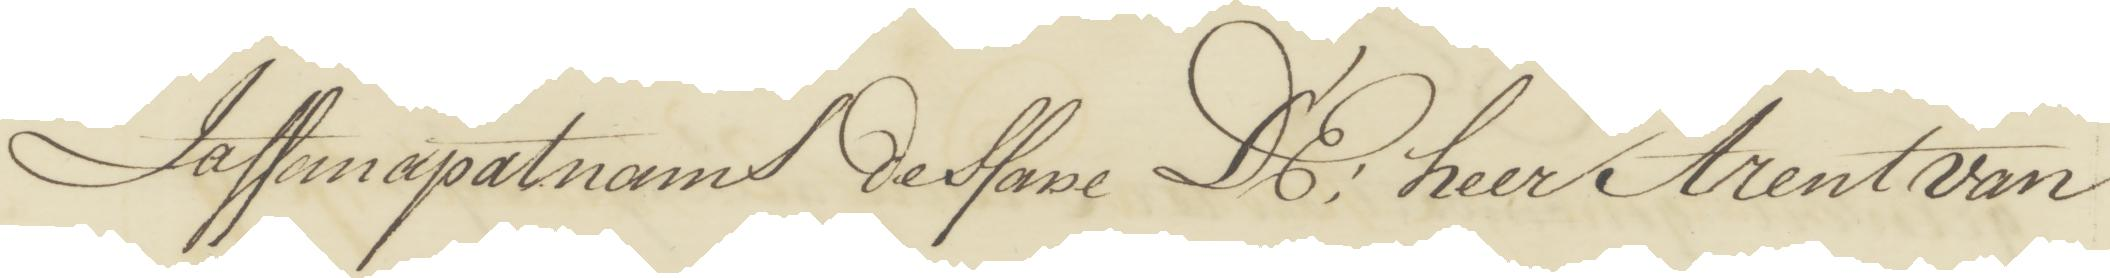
Jaffanapatnams dessave DE: heer Arent van
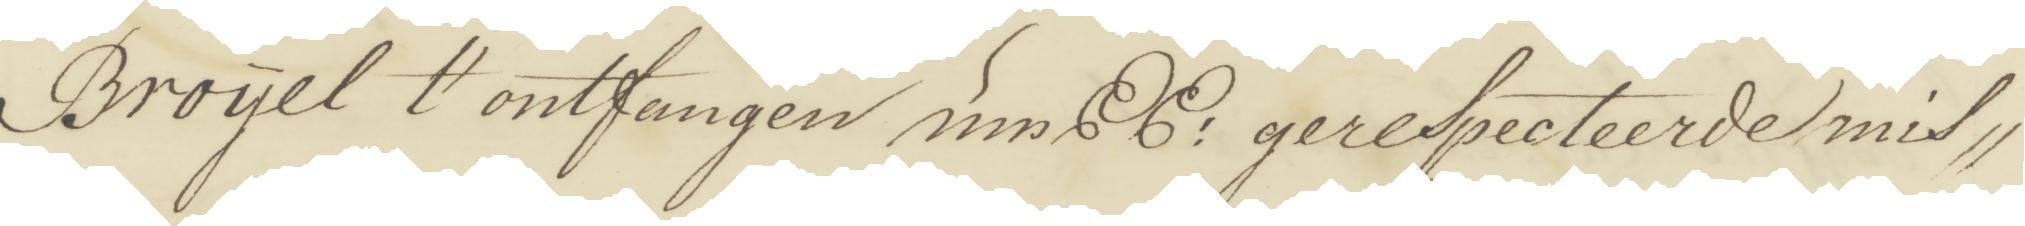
Broijel t' ontfangen uw EE: gerespecteerde mis„
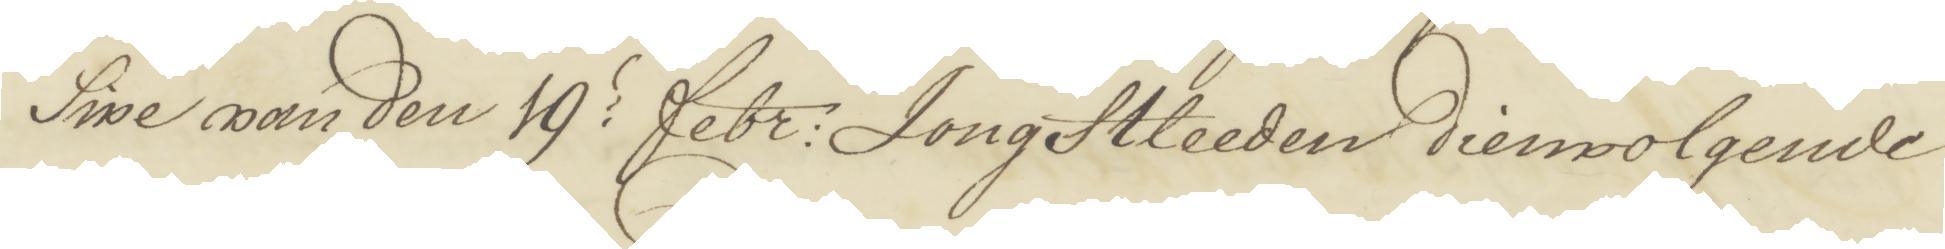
sive van den 19:' febr: Jongstleeden dienvolgende
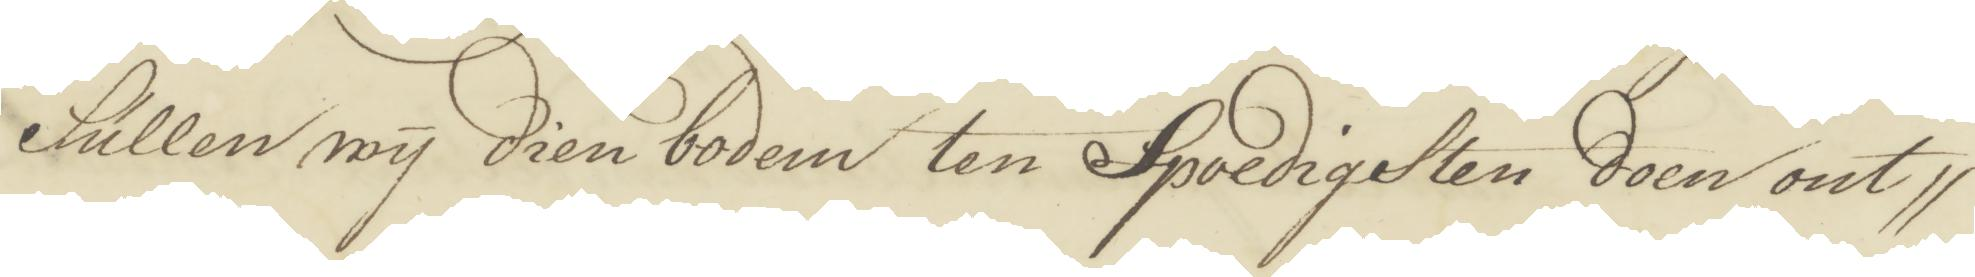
sullen wij dien bodem ten Spoedigsten doen ont„
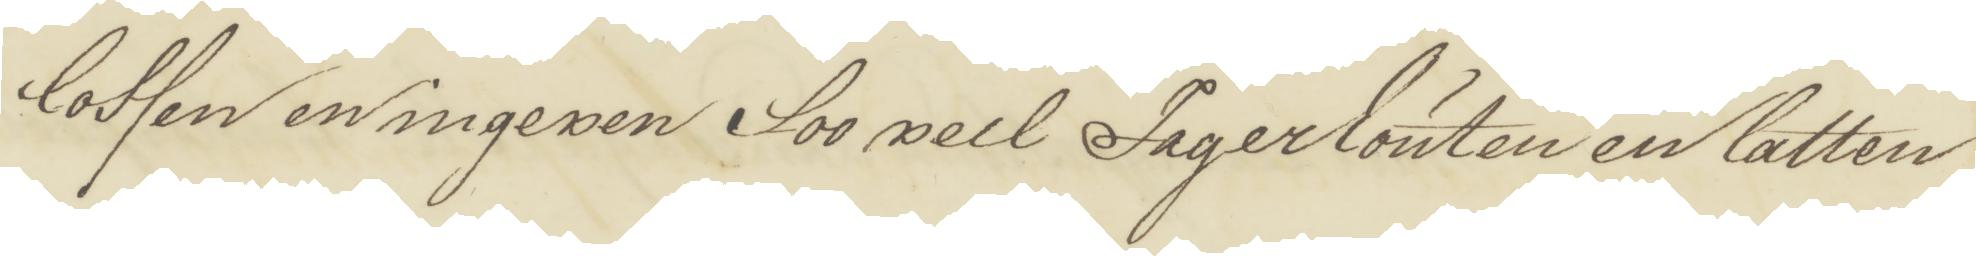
lossen en ingeven soo veel Jagerhouten en latten
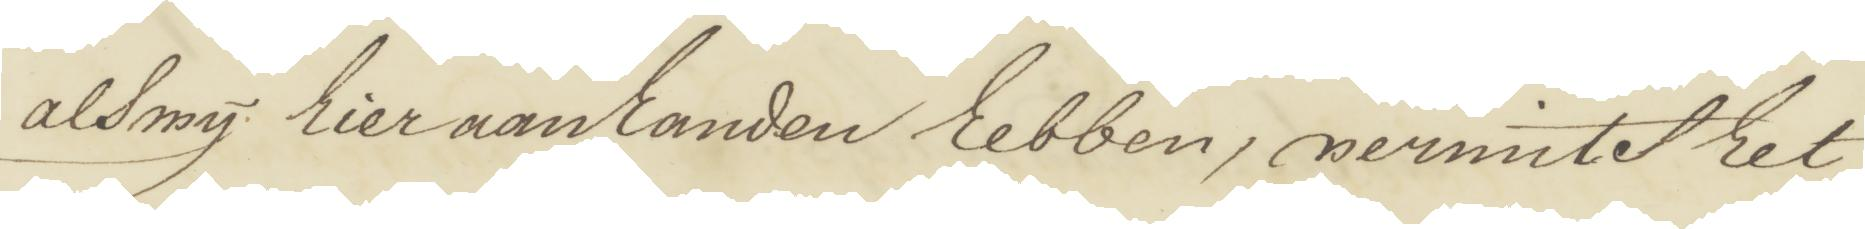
als wij hier aanhanden hebben, vermits het
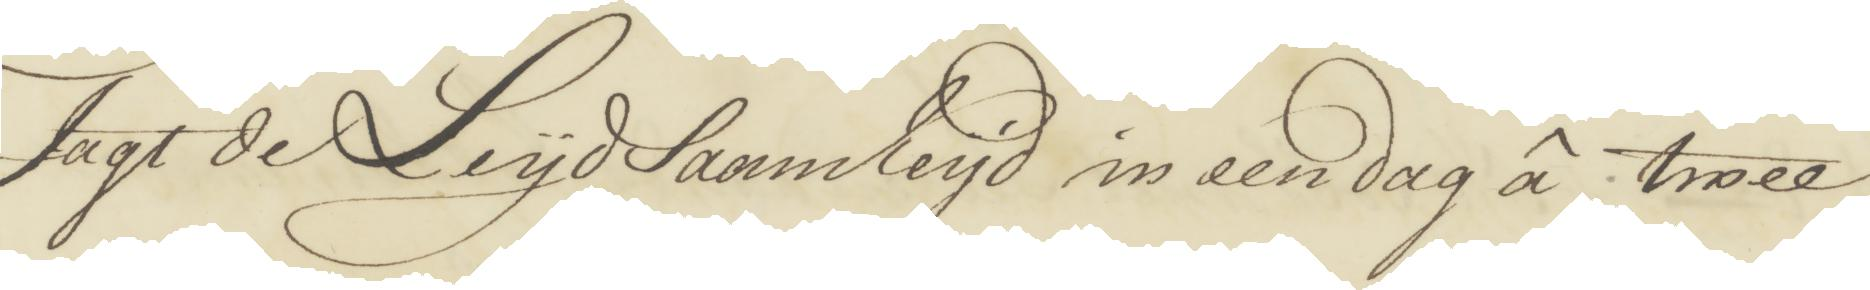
Jagt de Leijdsaamheijd in een dag â twee
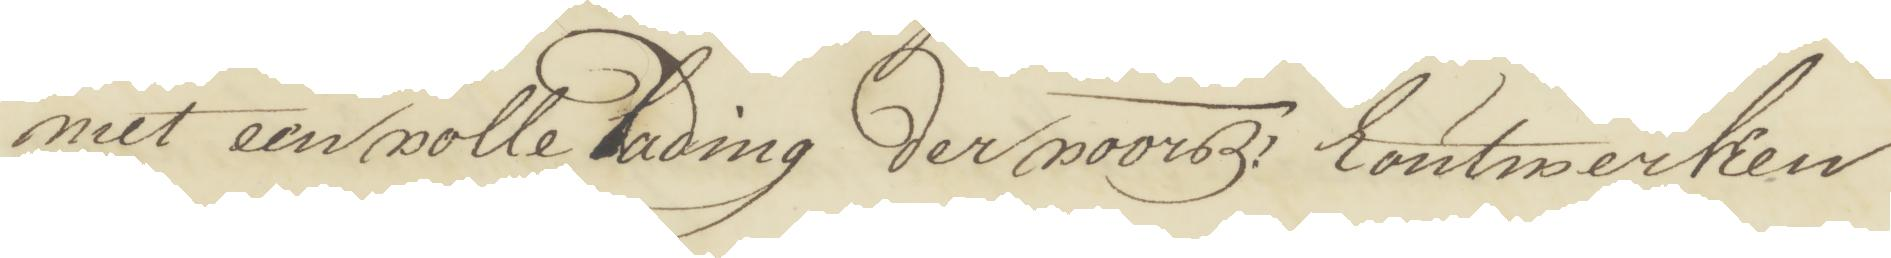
met een volle lading der voorsz: houtwerken
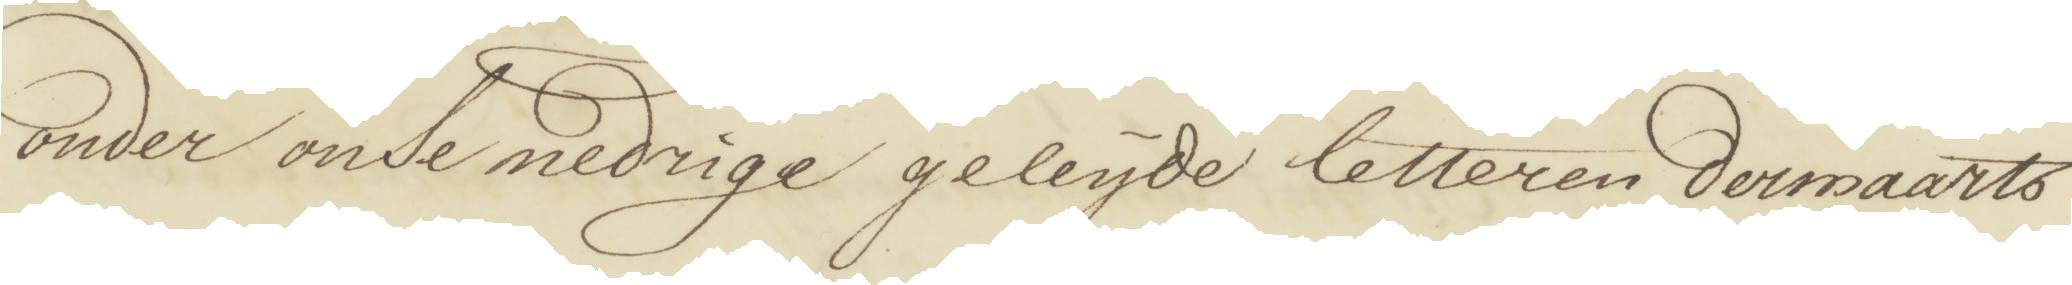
onder onse nedrige geleijde letteren derwaarts
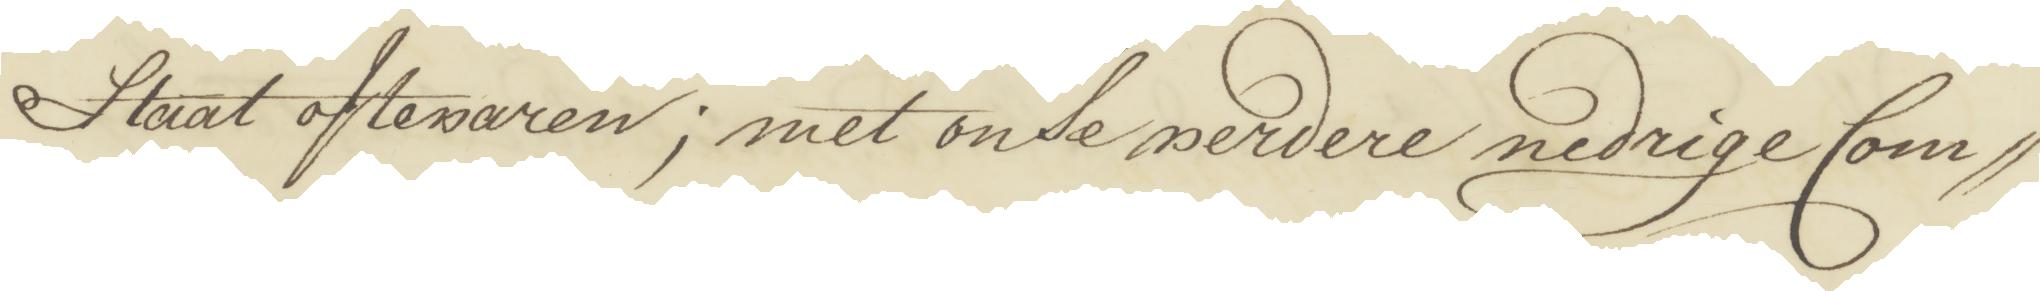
staat oftevaren; met onse verdere nedrige Com„
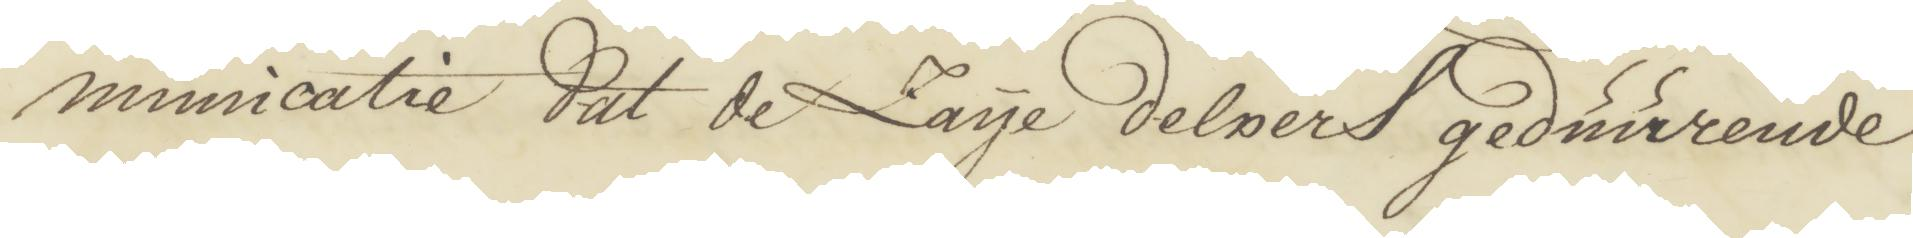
municatie dat de zaije delvers geduurende
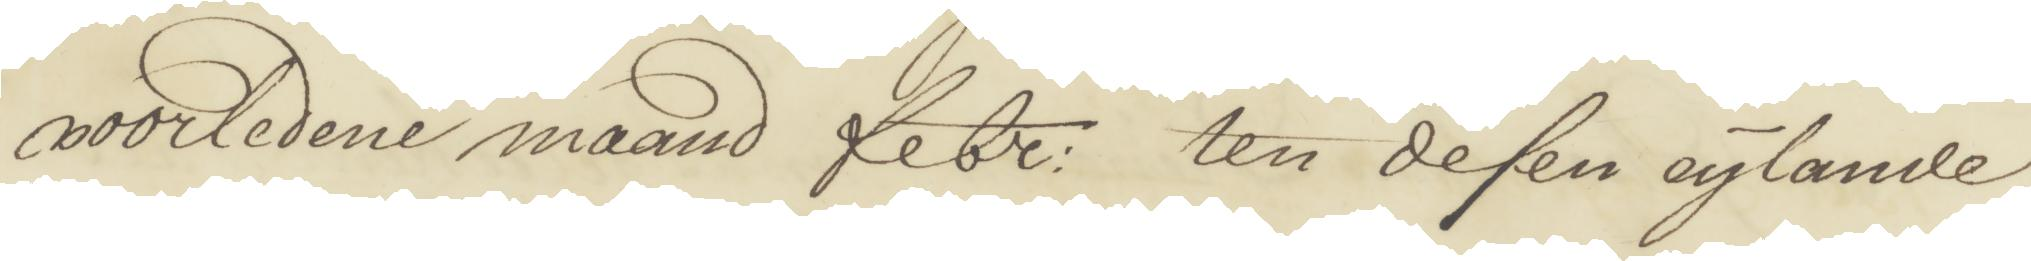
voorledene maand febr: ten desen eijlande
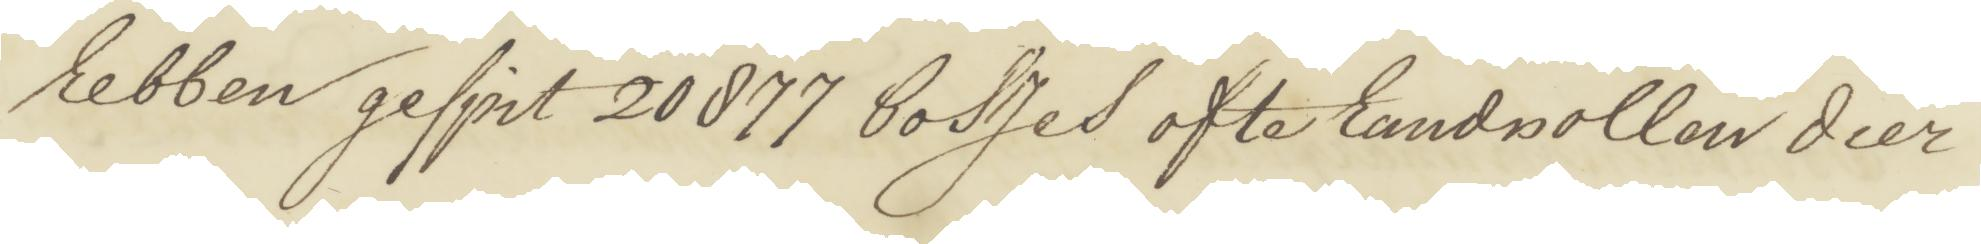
hebben gespit 20877 bosjes ofte handvollen dier
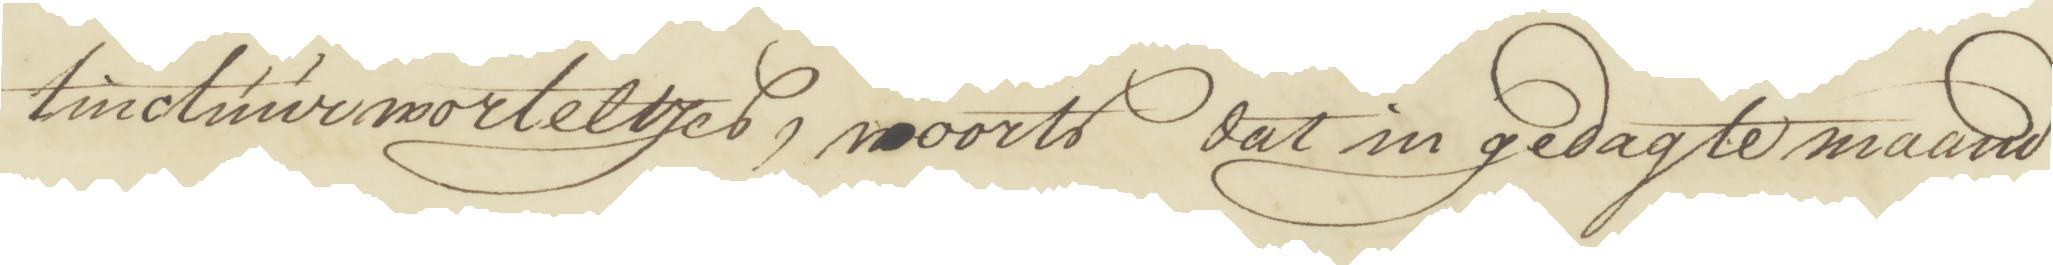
tinctuur worteltjes, voorts dat in gedagte maand
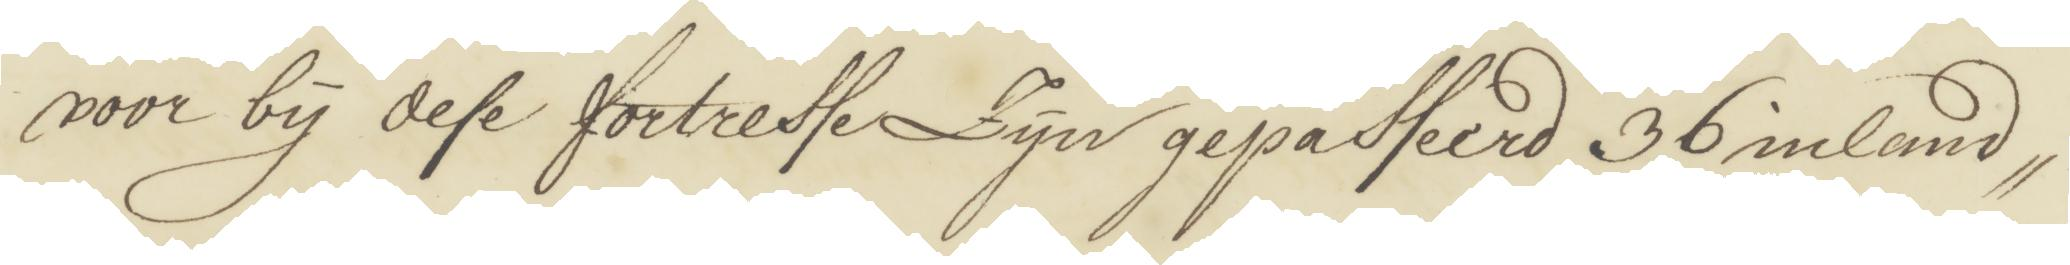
voor bij dese fortresse zijn gepasseerd 36 inland„
